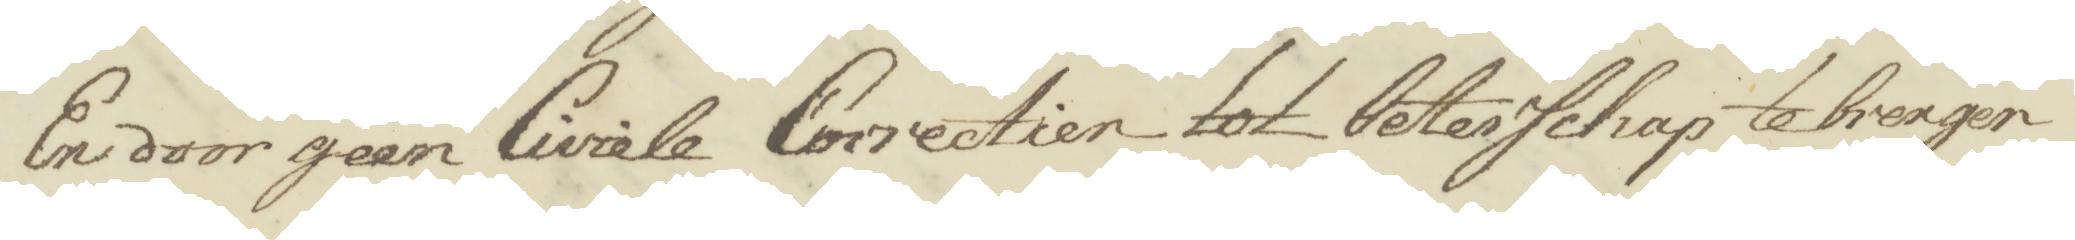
En door geen civiele correctien tot beterschap te brengen
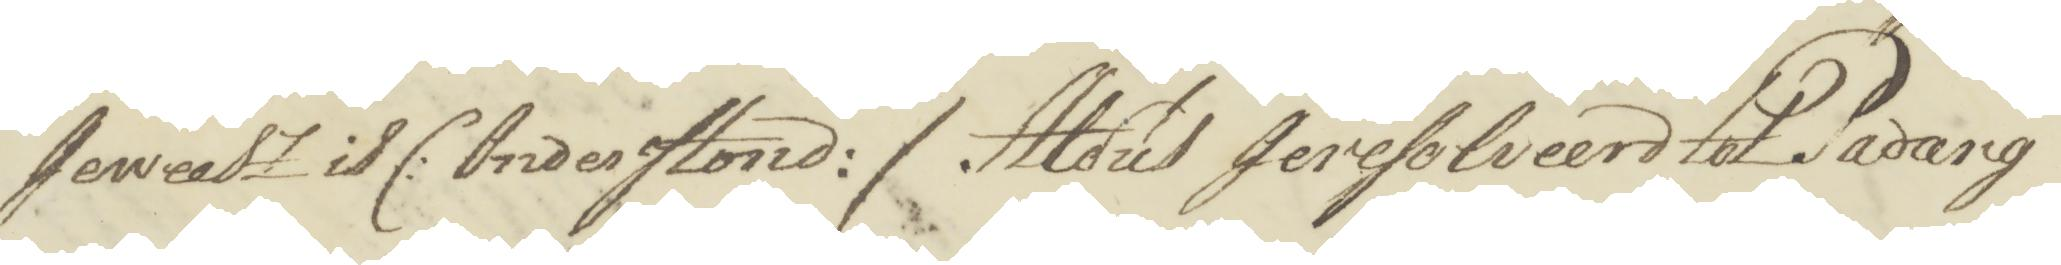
geweest is (: onderstond:/ Aldus geresolveerd tot Padang
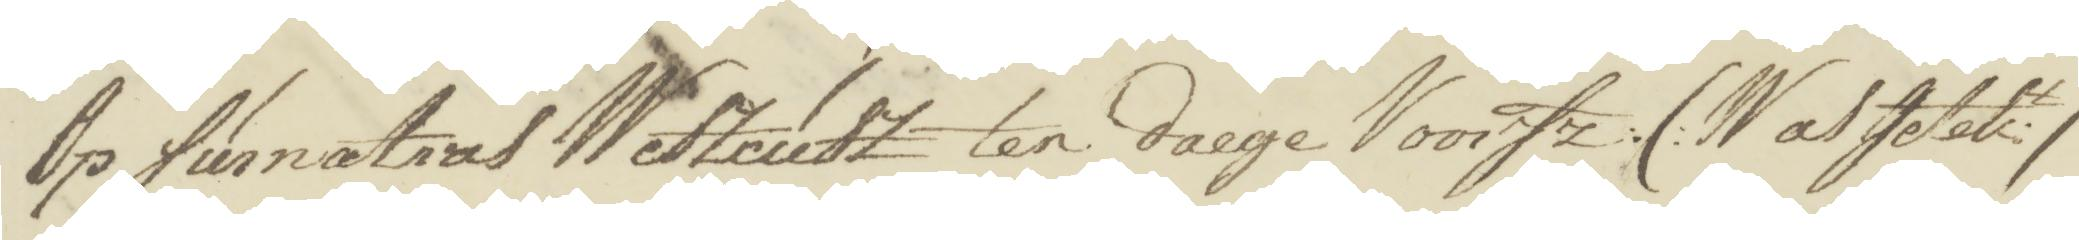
op sumatras westcust ten daege voorsz: (:Was getek:t/
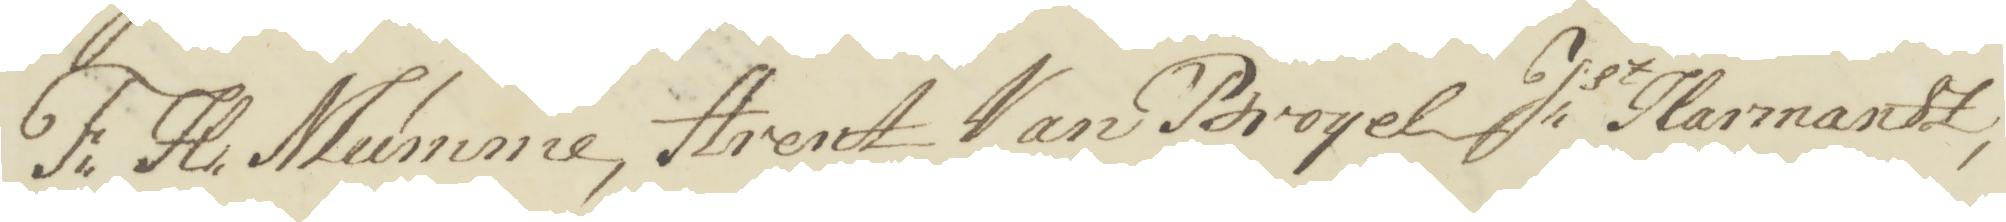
F„ H„ Mumme, Arent van Broyel J„st Harmansz,
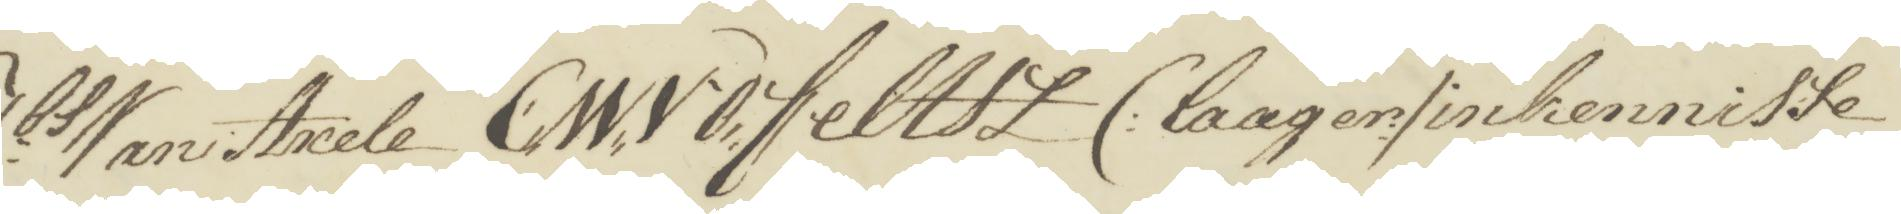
J„bs van Axele C„W„V d„feltsz (:laager:/ in kennisse
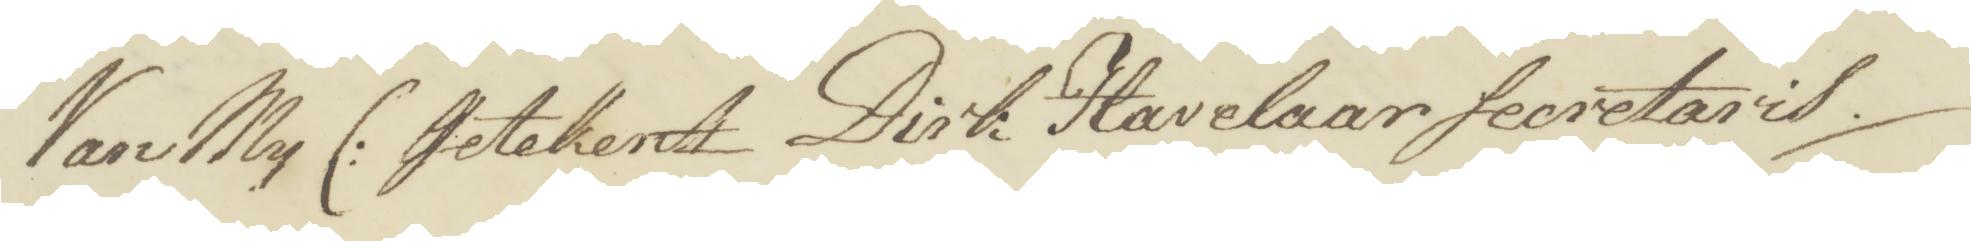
van mij (:getekent Dirk Havelaar secretaris.
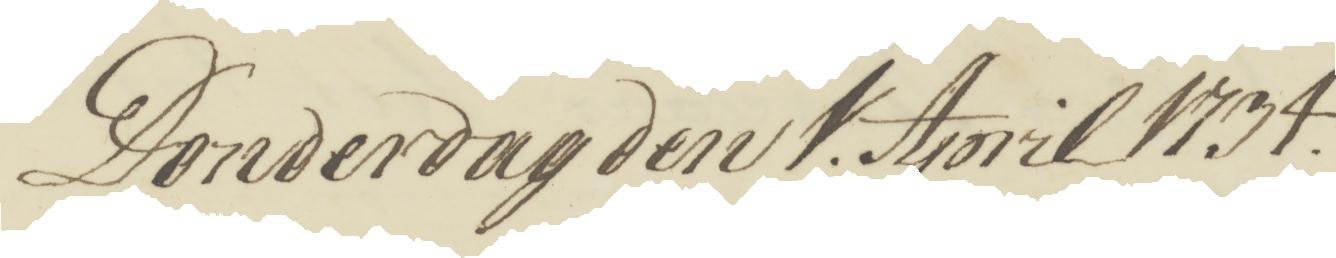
Donderdag den 1. April 1734.
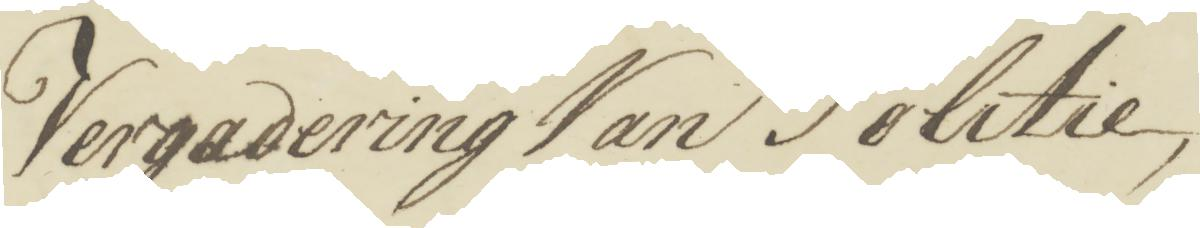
Vergadering van Politie,
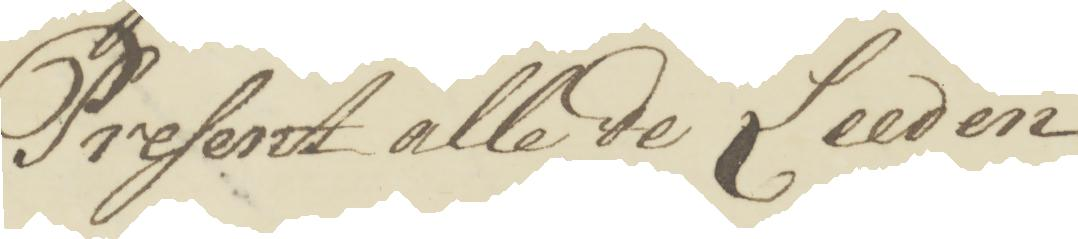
Present alle de Leeden
